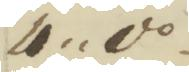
4 „ do
